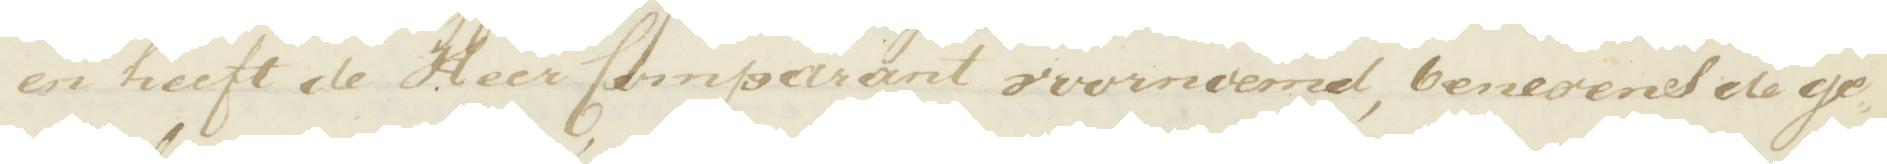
en heeft de Heer Comparant voornoemd, benevens de ge„
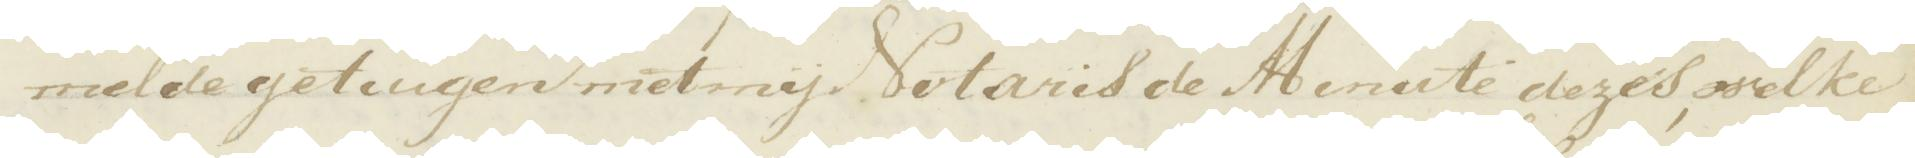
melde getuigen met mij Notaris de Minute dezes, welke
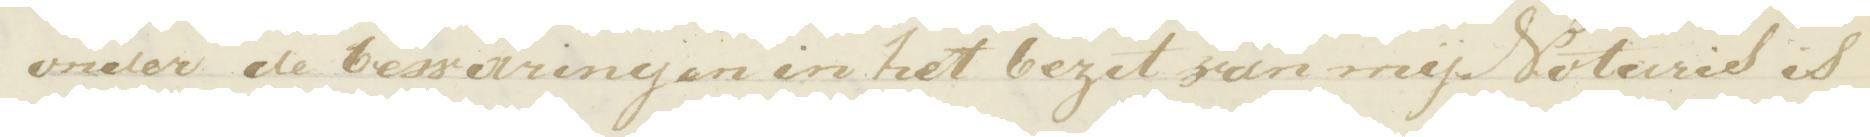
onder de bewaring en in het bezit van mij Notaris is
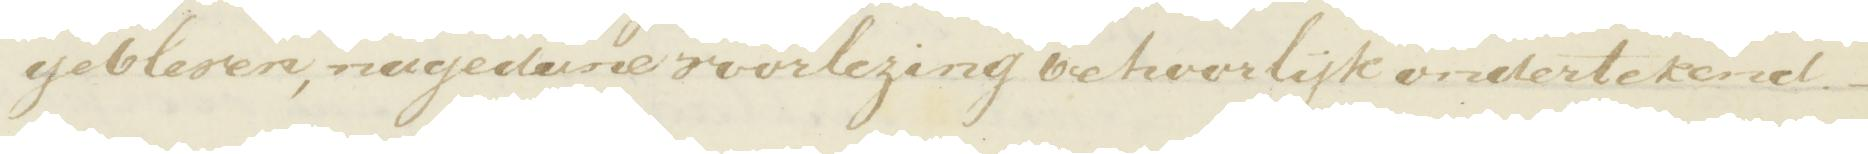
gebleven, na gedane voorlezing behoorlijk ondertekend
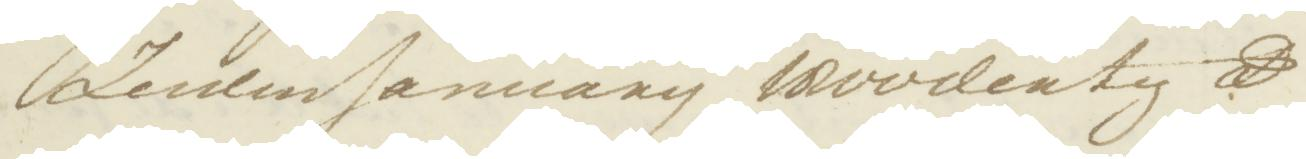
Zesden January 1800 dertig
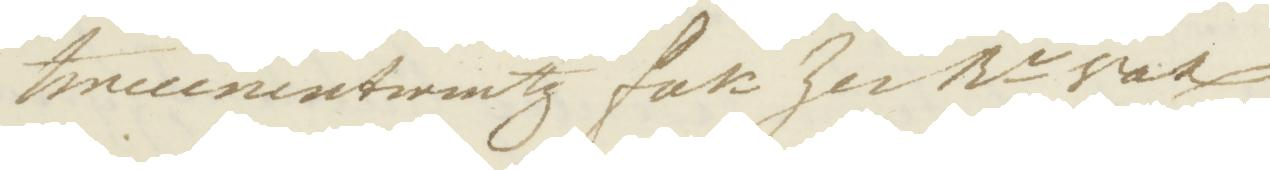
twee en en twintig fak Zes R=o vak
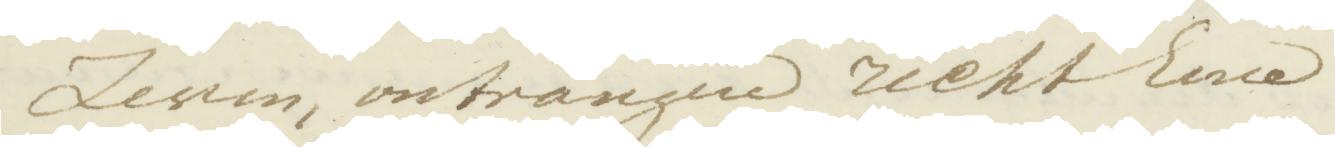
Zeven, ontvangen recht Eene
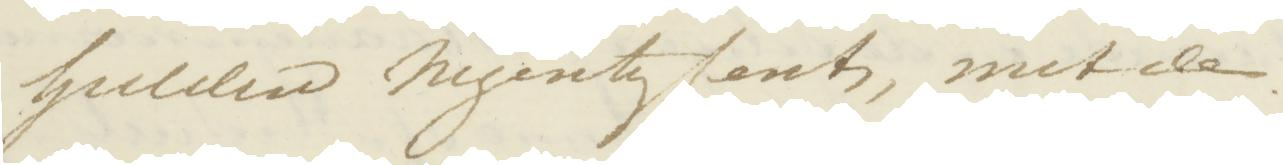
Gulden negentig Cents, met den
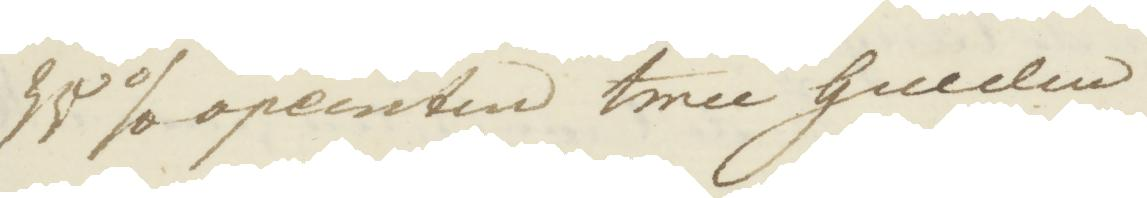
35% opcenten twee Gulden
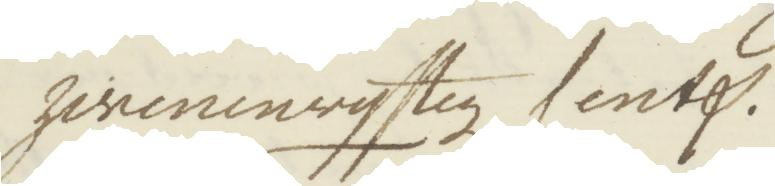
zeven en vyftig Cents.
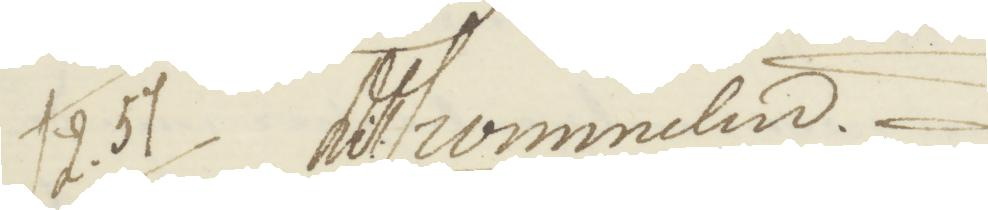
f 2.57 D:F:Crommelin.
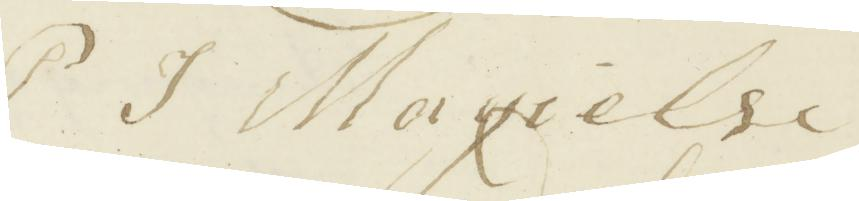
P. J Magielse
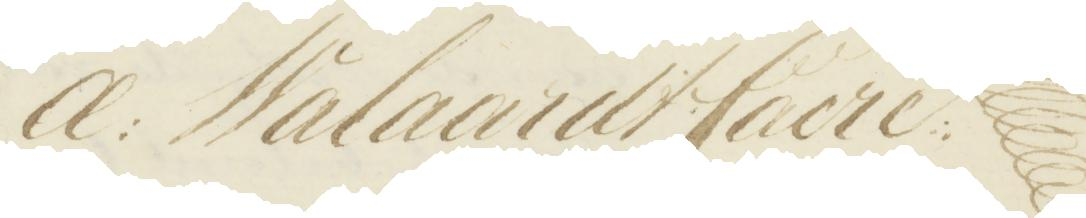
Ae: Walaardt Sacré
